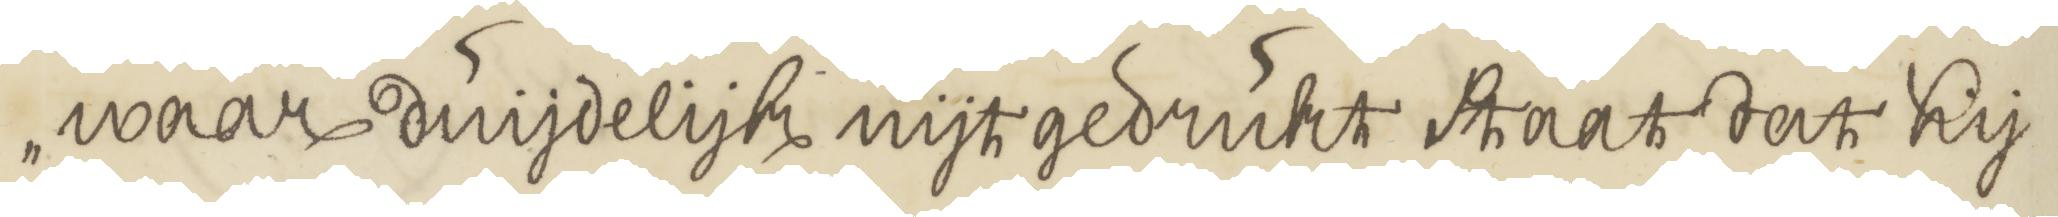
„waar duijdelijk uijt gedrukt staat dat hij
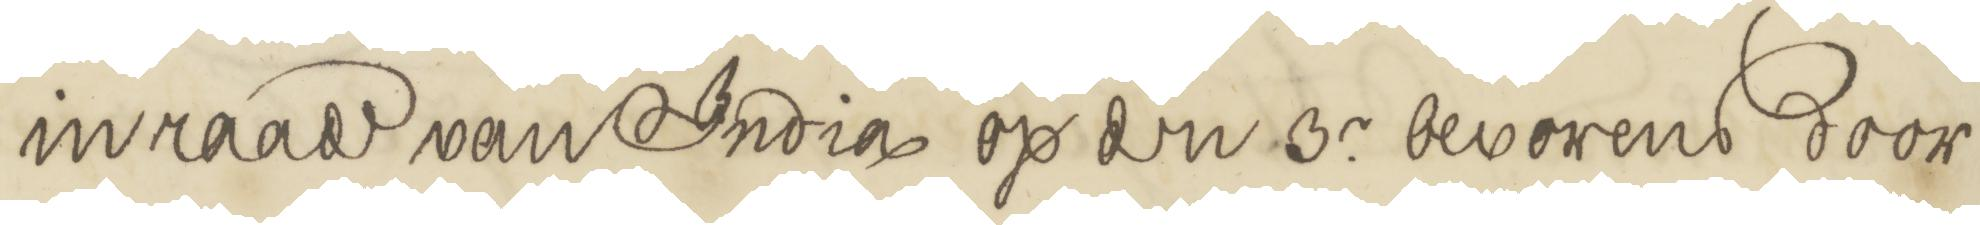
in raade van India op den 3.e bevorens door
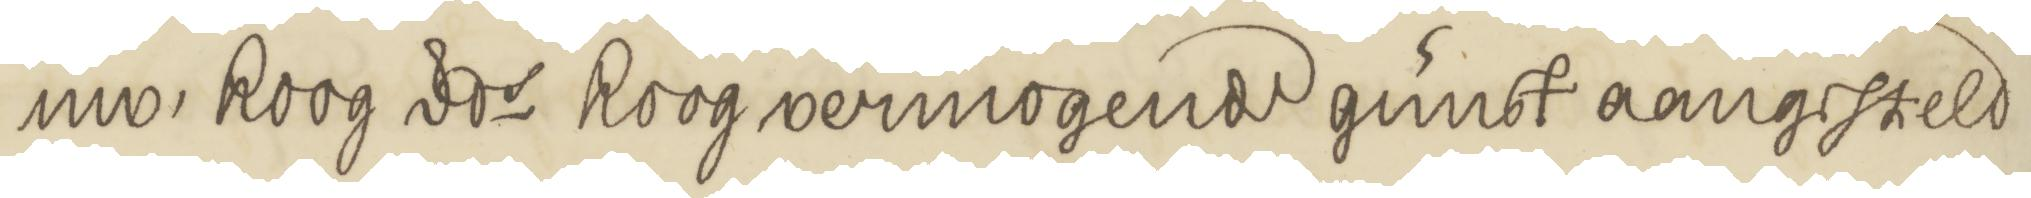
uw' hoog Ed-s hoog vermogende gunst aangesteld
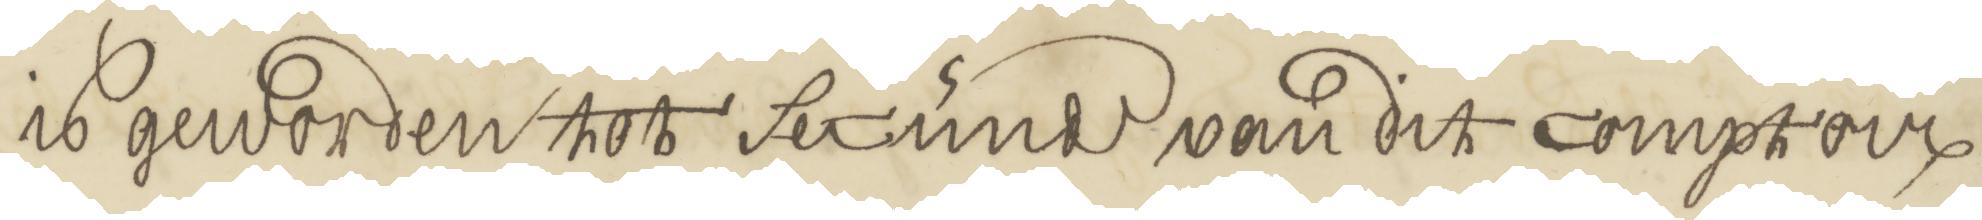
is geworden tot secunde van dit comptoir
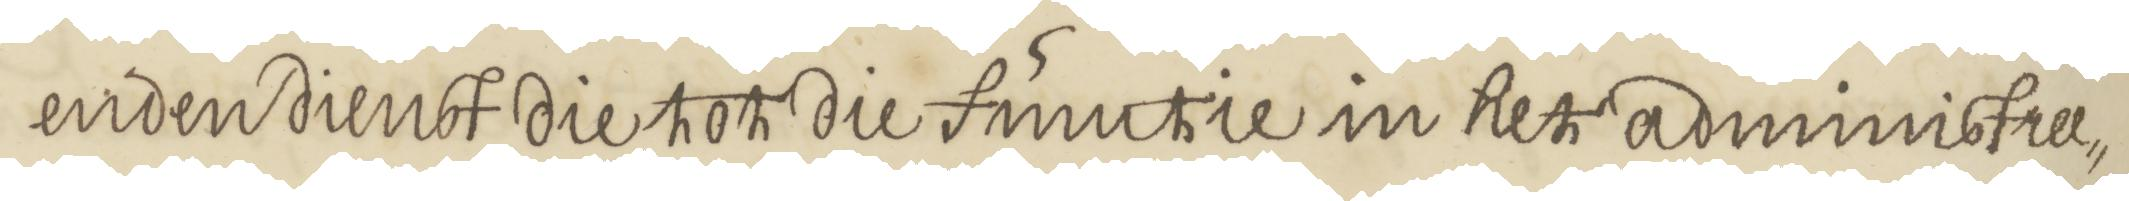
enden dienst die tot die functie in het administree„
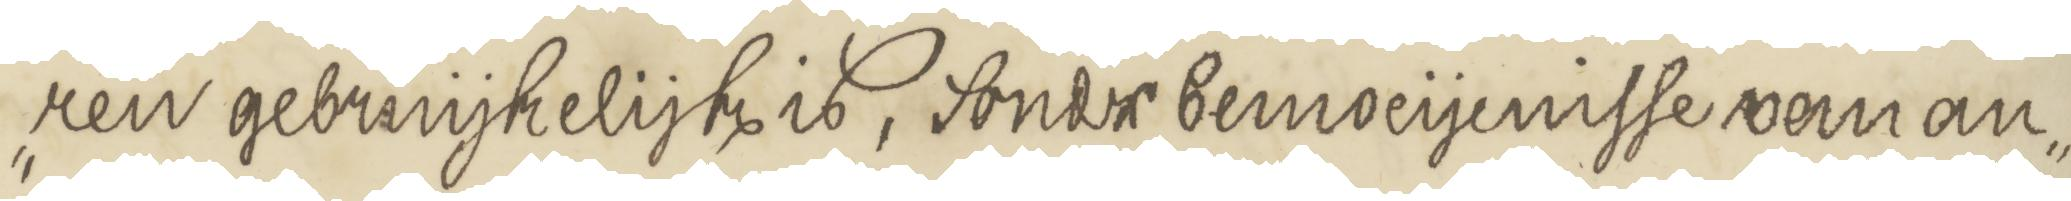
„ren gebruijkelijk is, sonder bemoeijenisse van an„
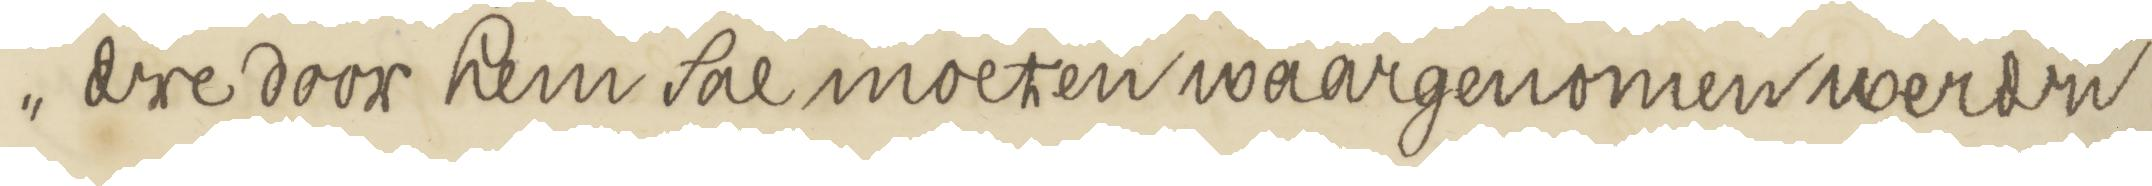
„dere door hem sal moeten waargenomen werden
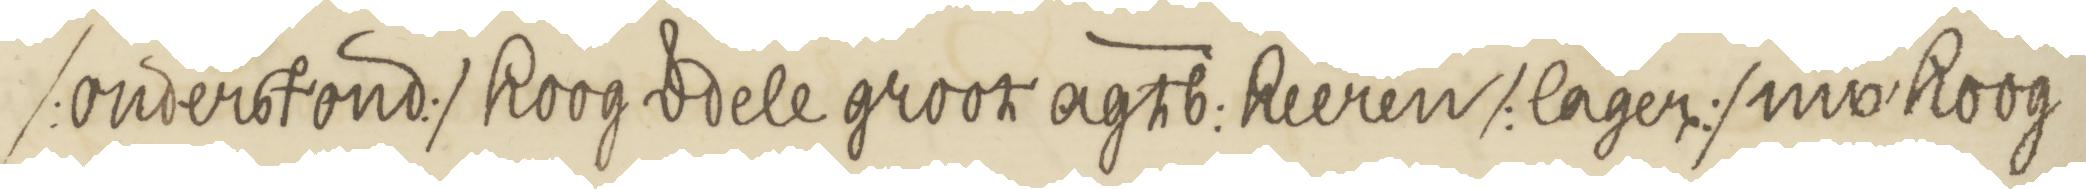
/:onderstond:/ hoog Edele groot agtb: heeren /:lager:/ uw' hoog
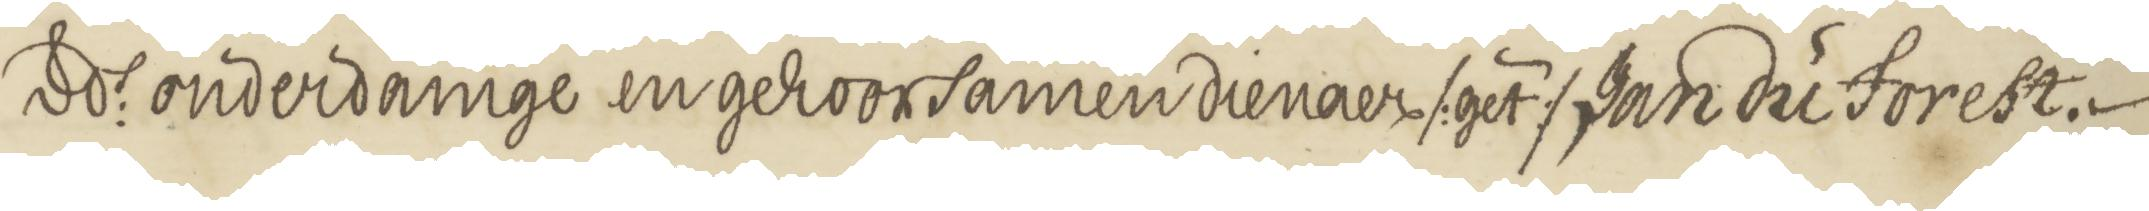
Ed:s onderdanige en gehoorsamen dienaer /:get:/ Jan du forest. —
